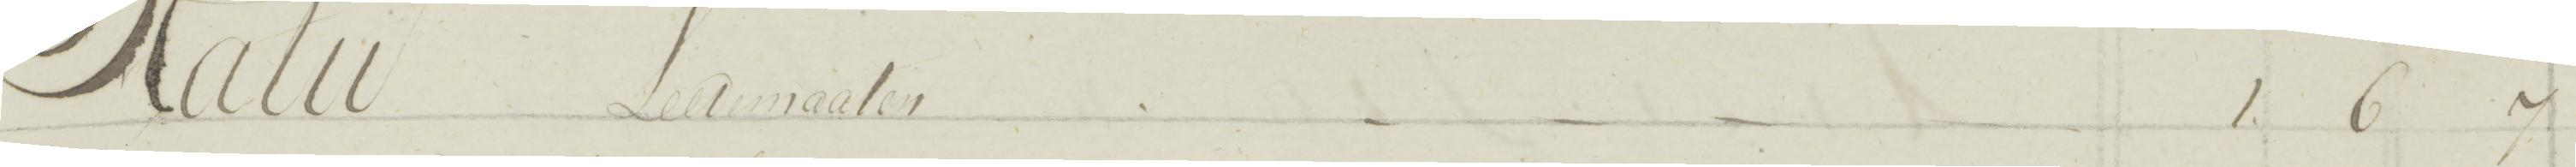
Hatu Leedemaaten - - - - - 1: 6 7.
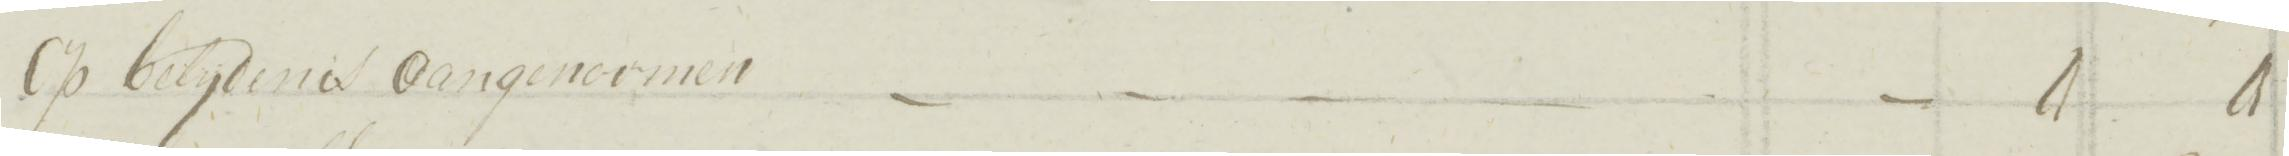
Op belijdenis aangenoomen - - - - — 4 4
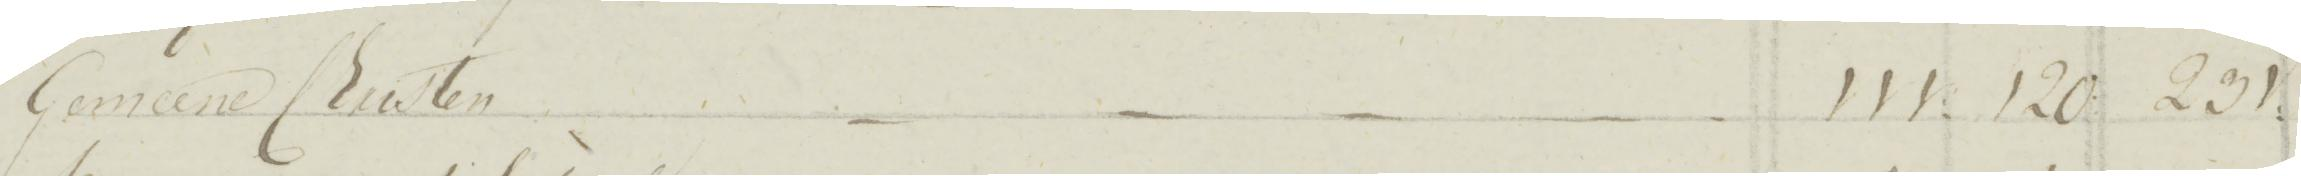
Gemeene Christen - - - - - 111: 120: 231:
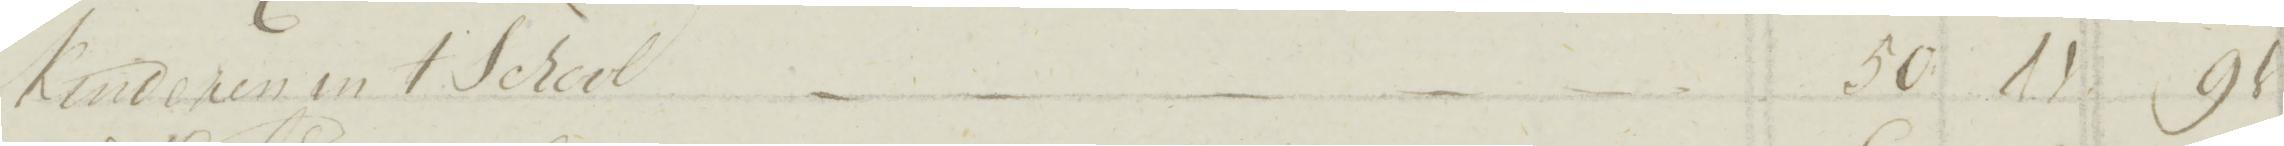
Kinderen in t School - - - - - 50: 41: 91
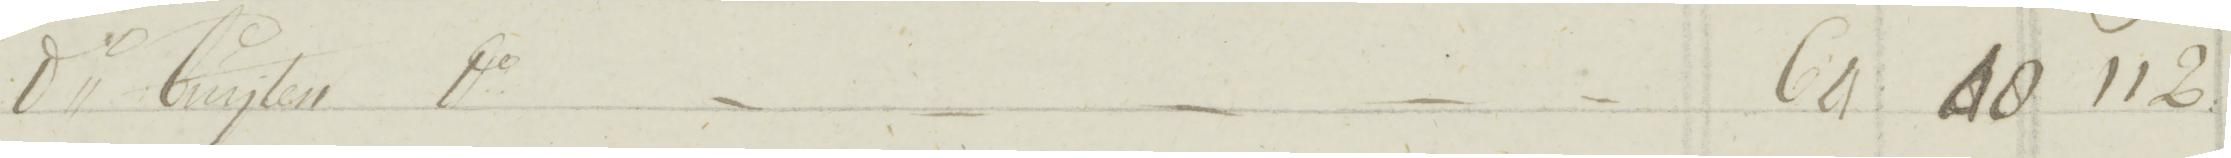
d„o buijten d„o - - - - - 64: 48 112:
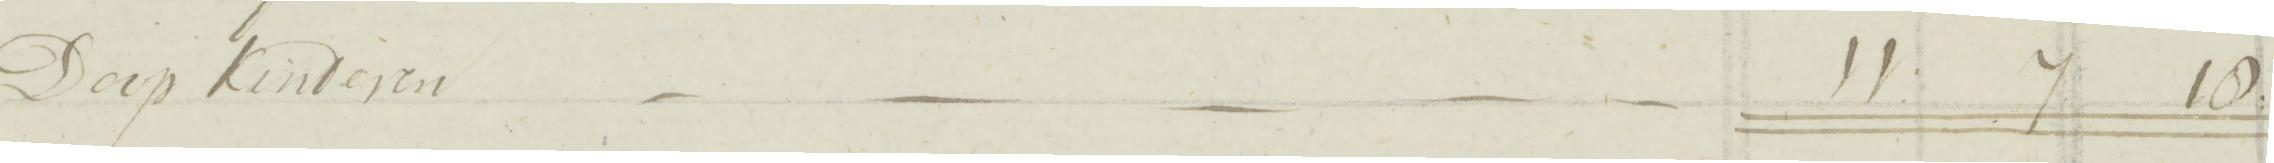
Doop kinderen - - - - - 11: 7 18:
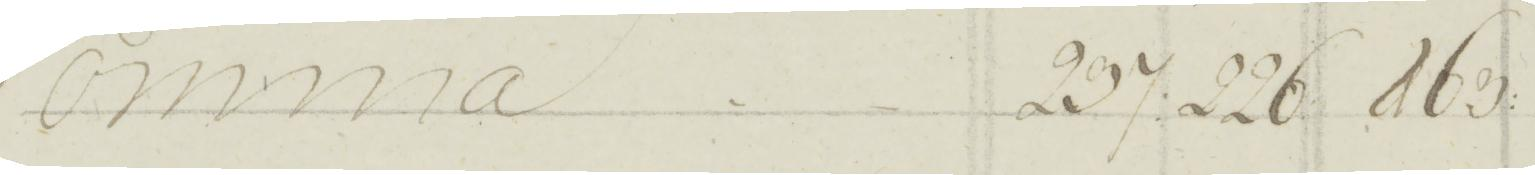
Somma 237: 226:463:
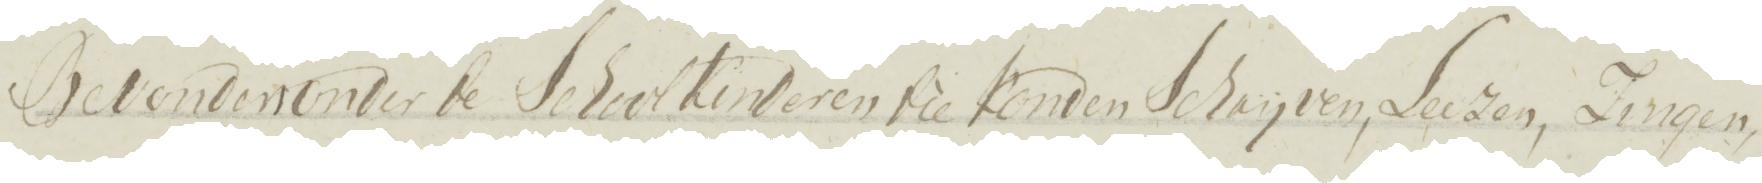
Bevonden onder de Schoolkinderen die konden schrijven, Leezen, Zingen,
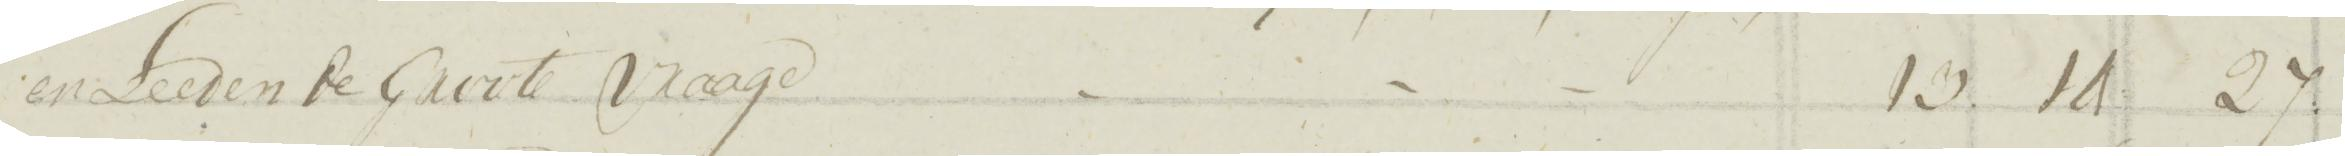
en Leeden de Groote vraage - - - 13: 14: 27:
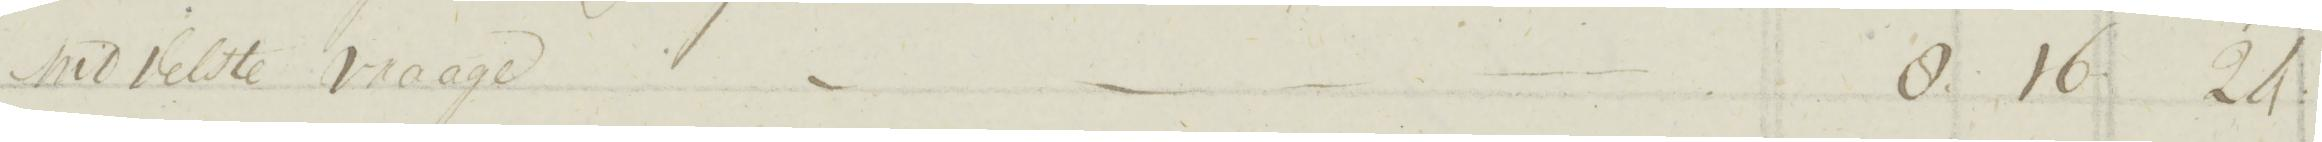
Middelste vraage - - - - 8. 16. 24:
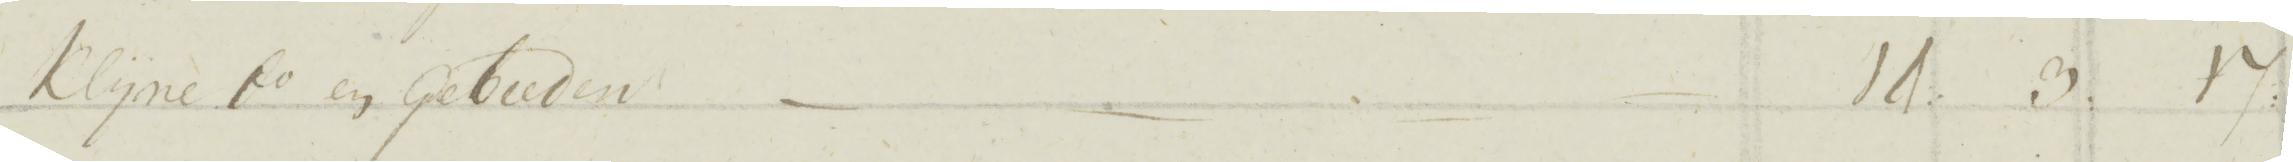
Klijne do en gebeeden - - - - 14: 3: 17:
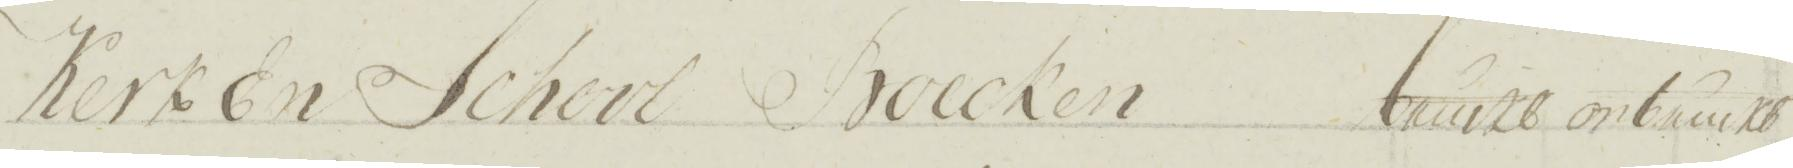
Kerk En School Boecken bruikb onbruikb
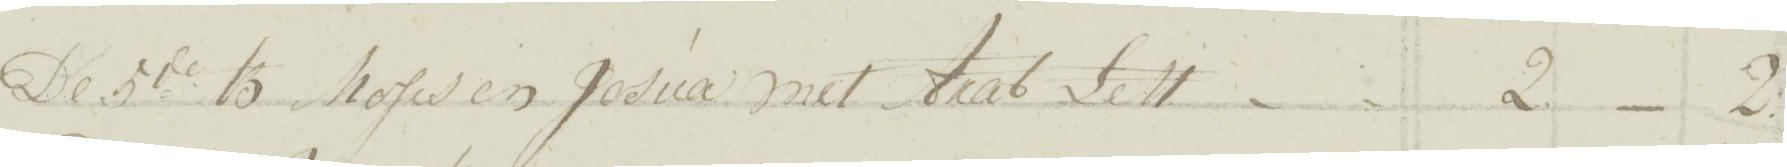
De 5=de B Moses en Josua met Arab Lett - - 2: — 2:
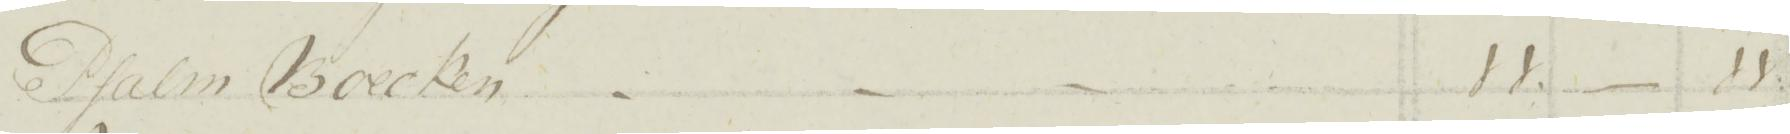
Psalm Boecken - - - .. 11. — 11:
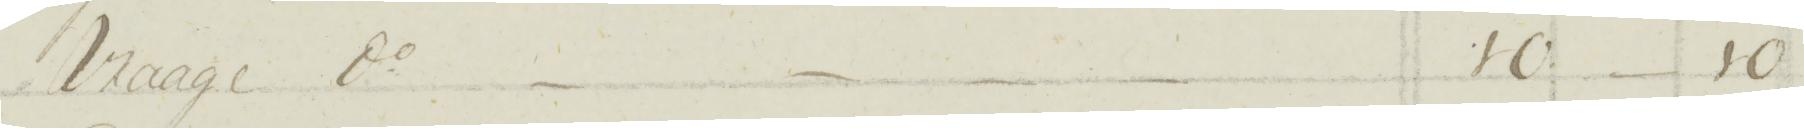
Vraage d:o - - - - 10: — 10
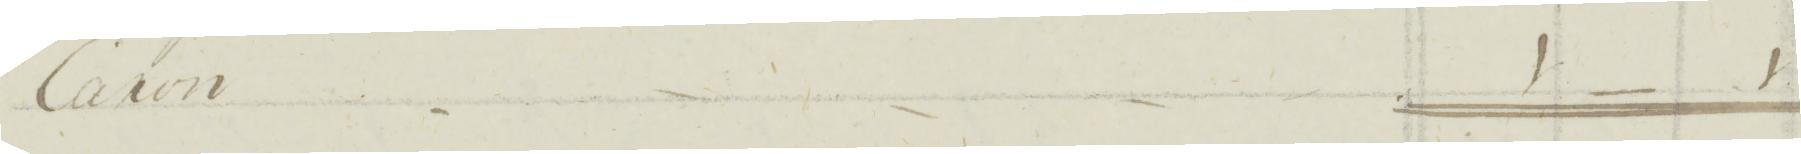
Canon - - - - 1: — 1.
